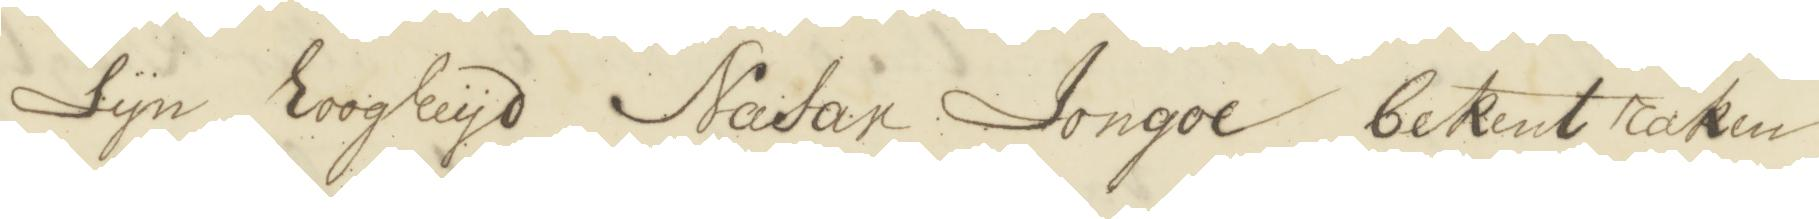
sijn hoogheijd Nasar Iongoe bekent raken
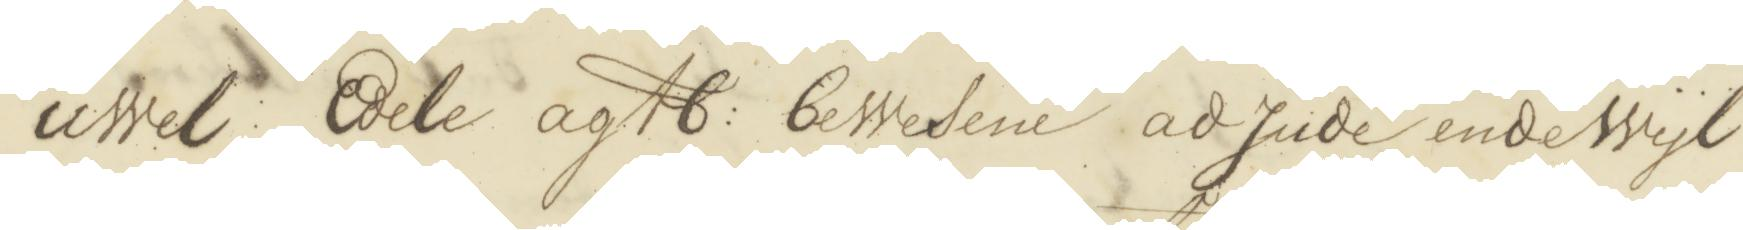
uwel: Edele agtb: bewesene ad jude en de wijl
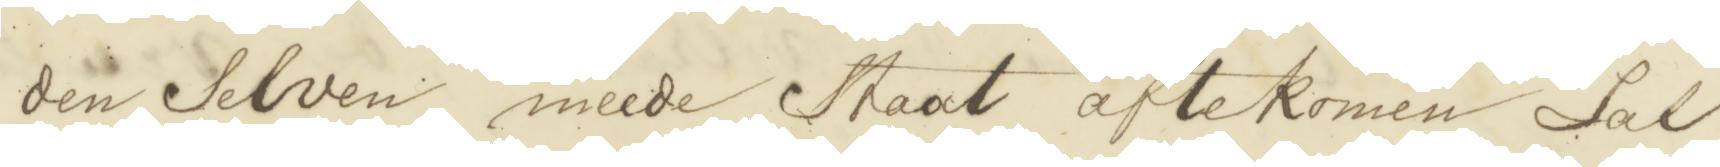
den selven meede staat aftekomen sal
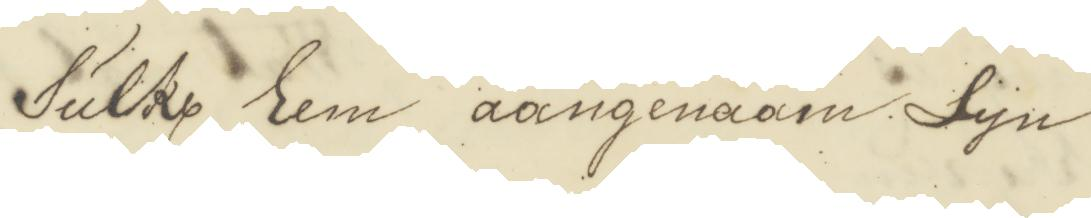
sulkx hem aangenaam sijn
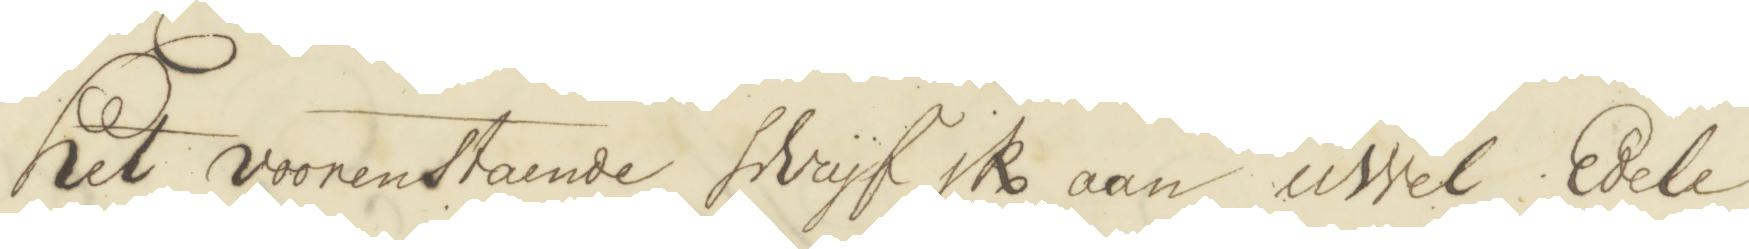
Het voorenstaende schrijf ik aan uwel Edele
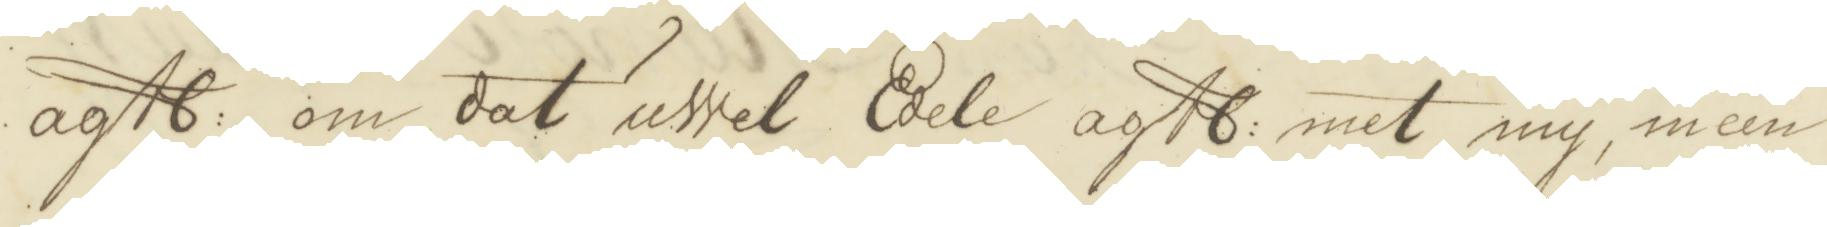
agtb:, om dat uwel Edele agtb: met mij, in een
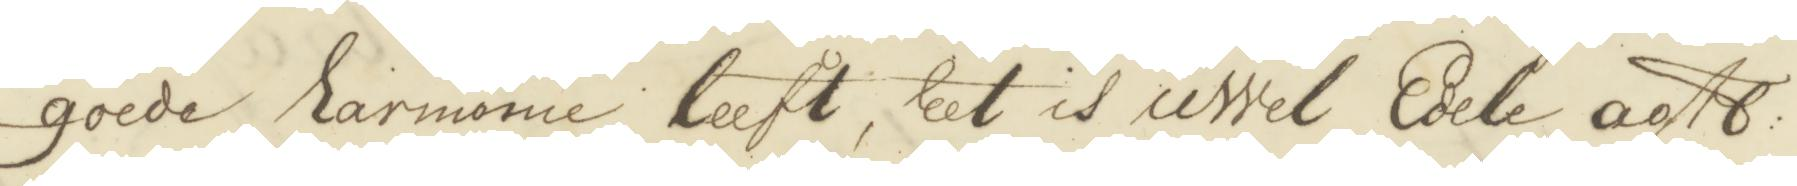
goede harmonie leeft, het is uwel Edele agtb:
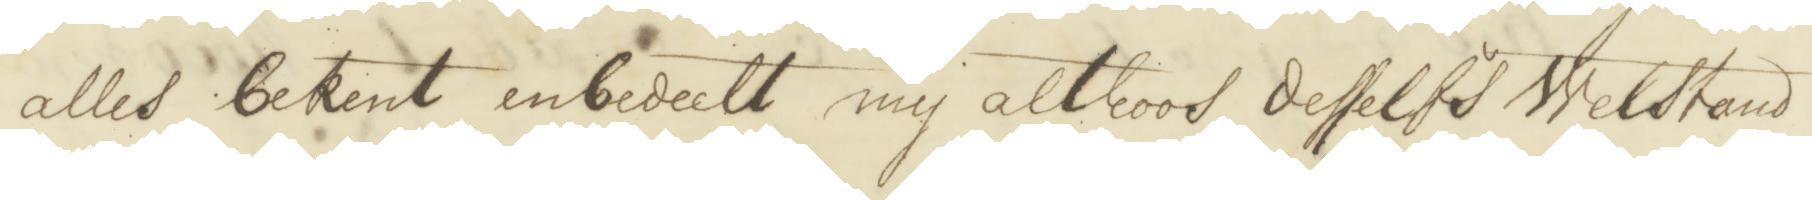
alles bekent en bedeelt mij althoos desselfs welstand
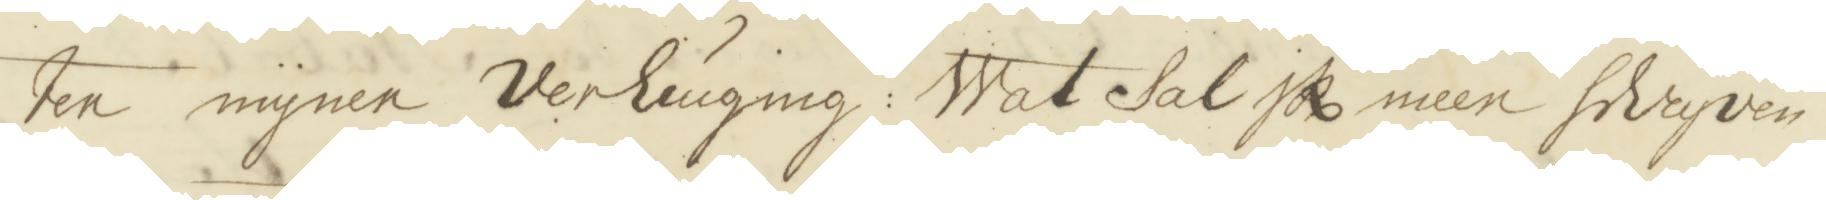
ter mijner verheuging: wat sal jk meer schrijven
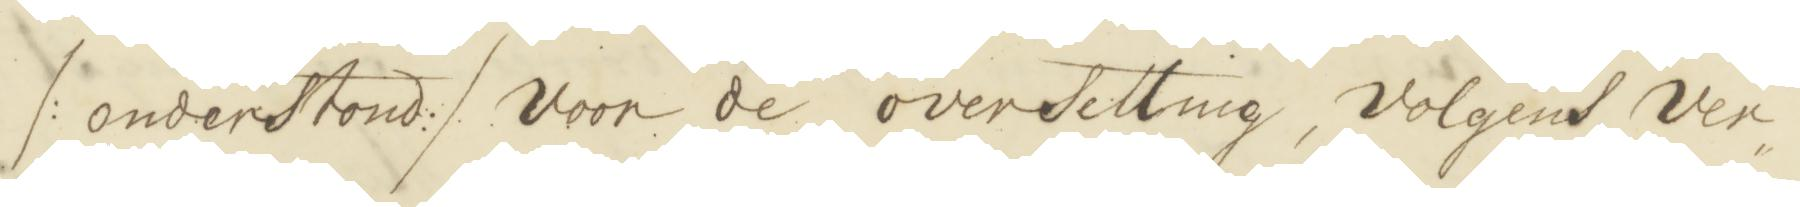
/:onderstond:/ voor de oversetting, volgens ver„
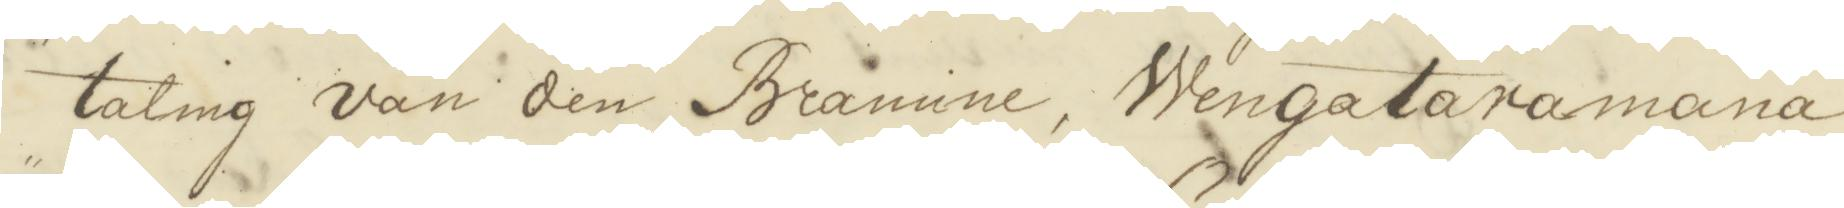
„taling van den Bramine, Wengataramana
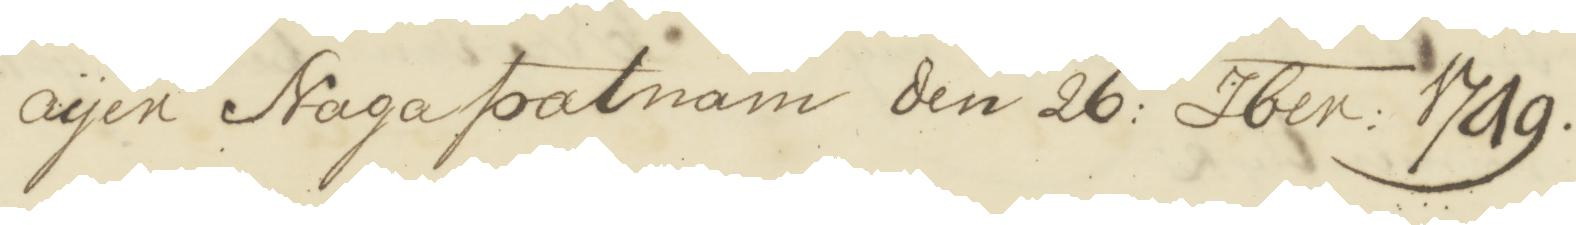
aijer Nagapatnam den 26:' Iber: 1749.
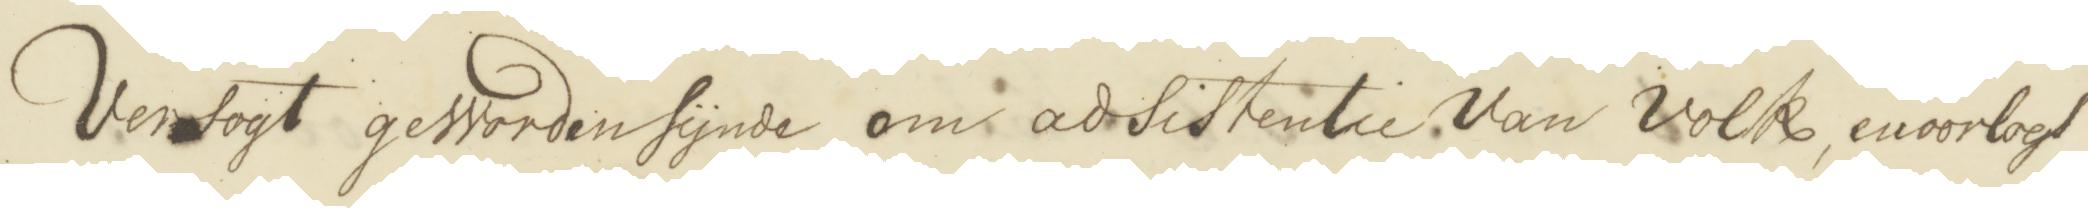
Versogt geworden sijnde om adsistentie van volk, en oorlogs
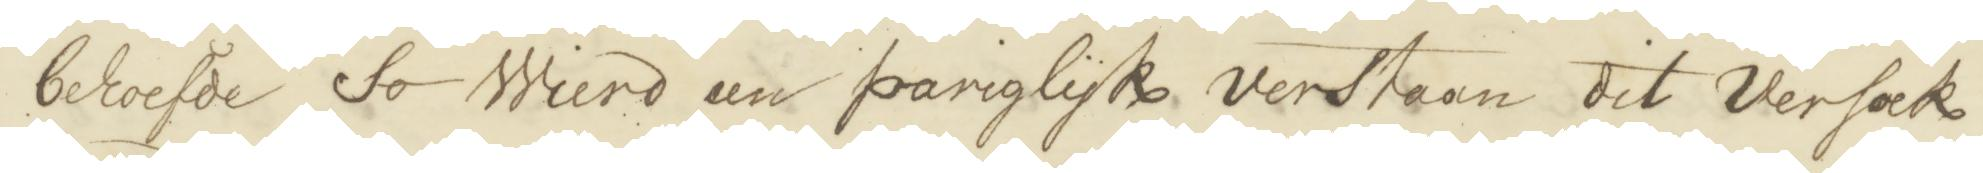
behoefde, so wierd een pariglijk verstaan dit versoek
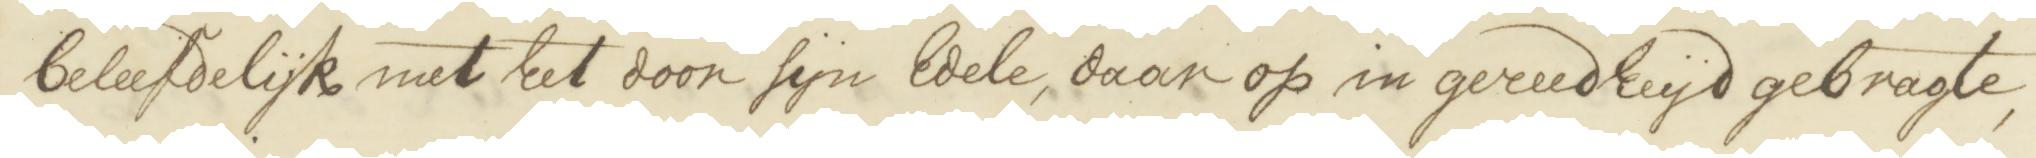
beleefdelijk met het door sijn Edele, daar op in gereedheijd gebragte,
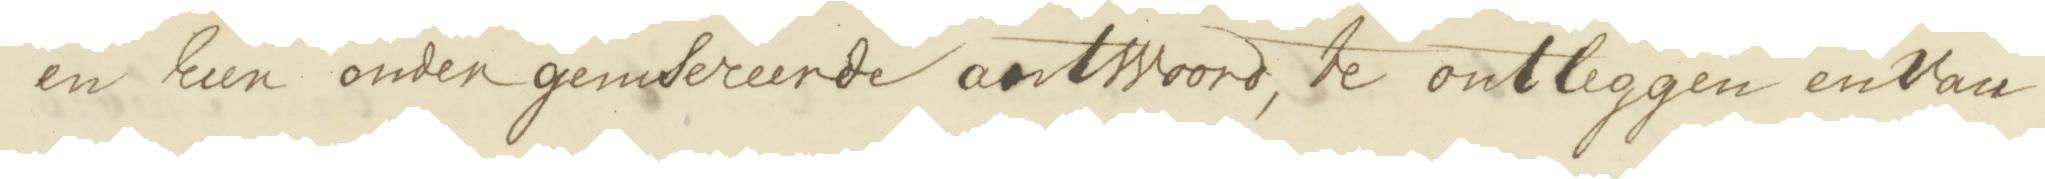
en hier onder geinsereerde antwoord, te ontleggen en van
